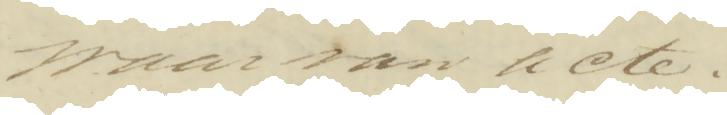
waar van acte.
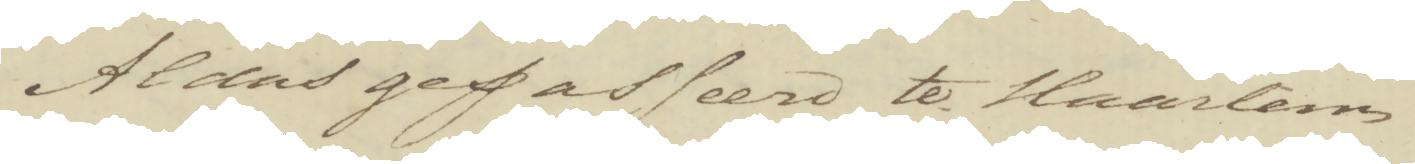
Aldus gepasseerd te Haarlem
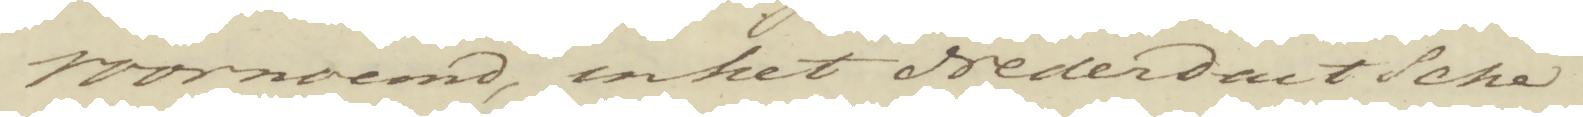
voornoemd, in het Nederduitsche
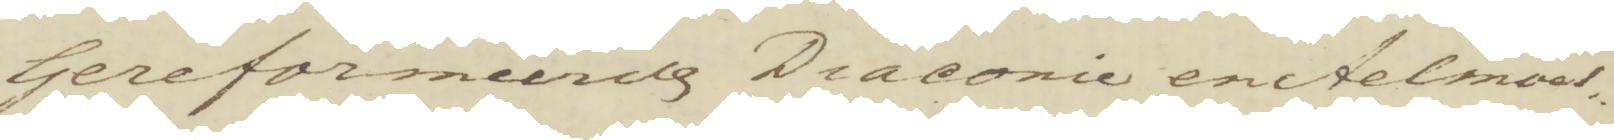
Gereformeerde Diaconie en Aelmoes„
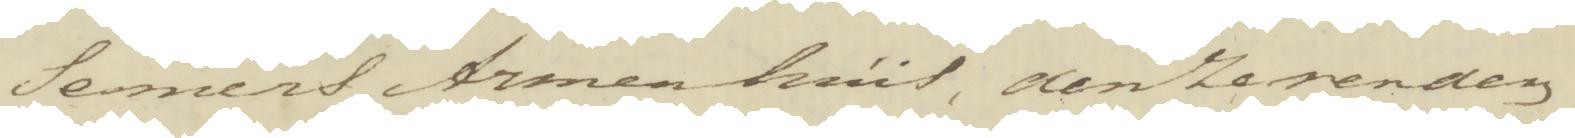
seniers Armenhuis, den zevenden
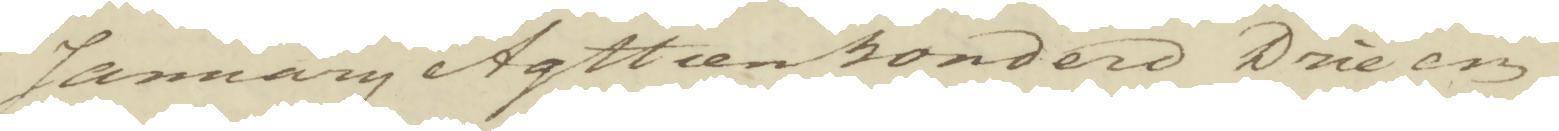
January Agttien honderd Drie en
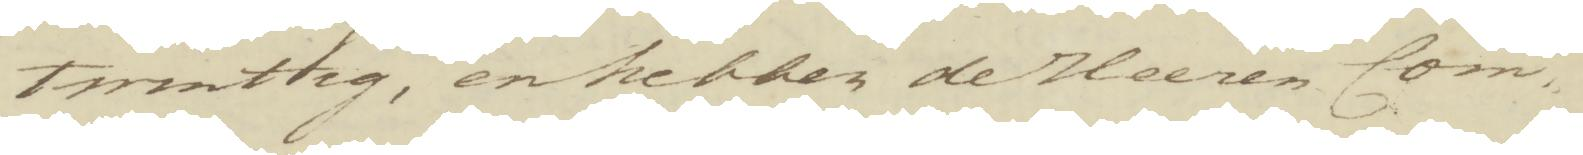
twinttig, en hebben de Heeren Com„
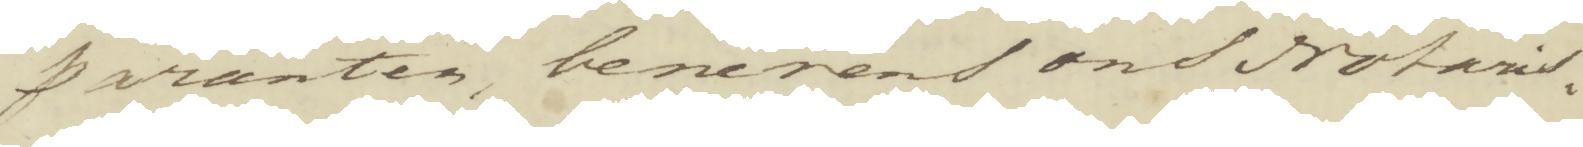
paranten, benevens ons Notaris„
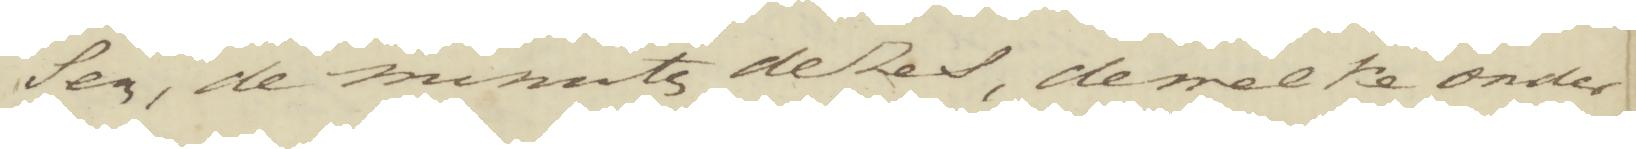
„sen, de minute dezes, de welke onder
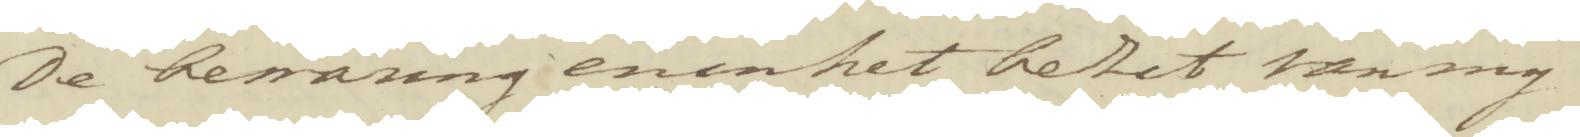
de bewaring en in het bezit van my
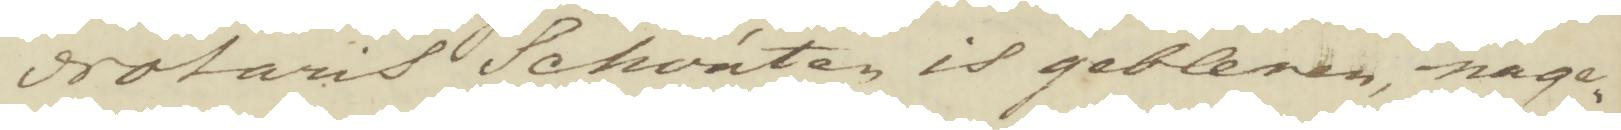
Notaris Schouten is gebleven, nage„
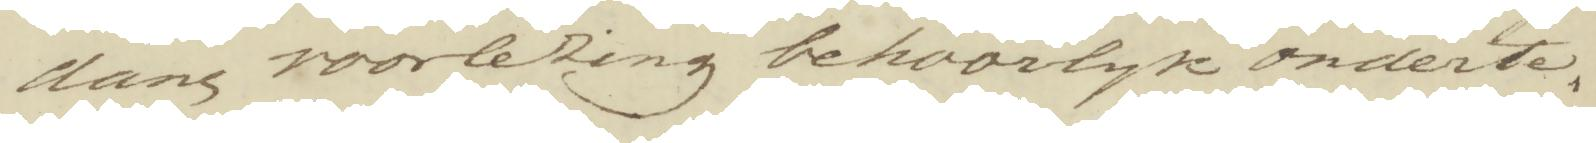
dane voorlezing behoorlyk onderte„
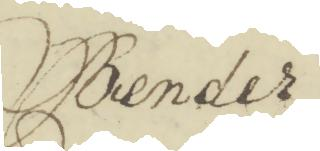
Bender
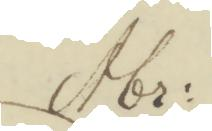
Abr:
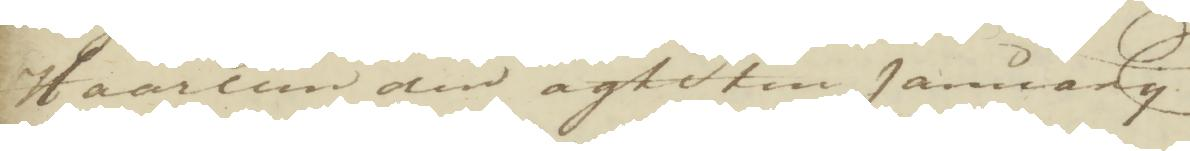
Haarlem den agtsten January,
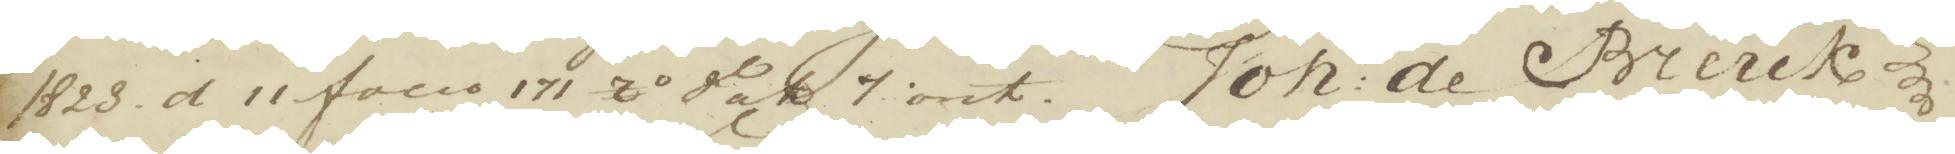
1823. d 11 folio 171 r=o Vak 7 ont. Joh:s de Breuk
